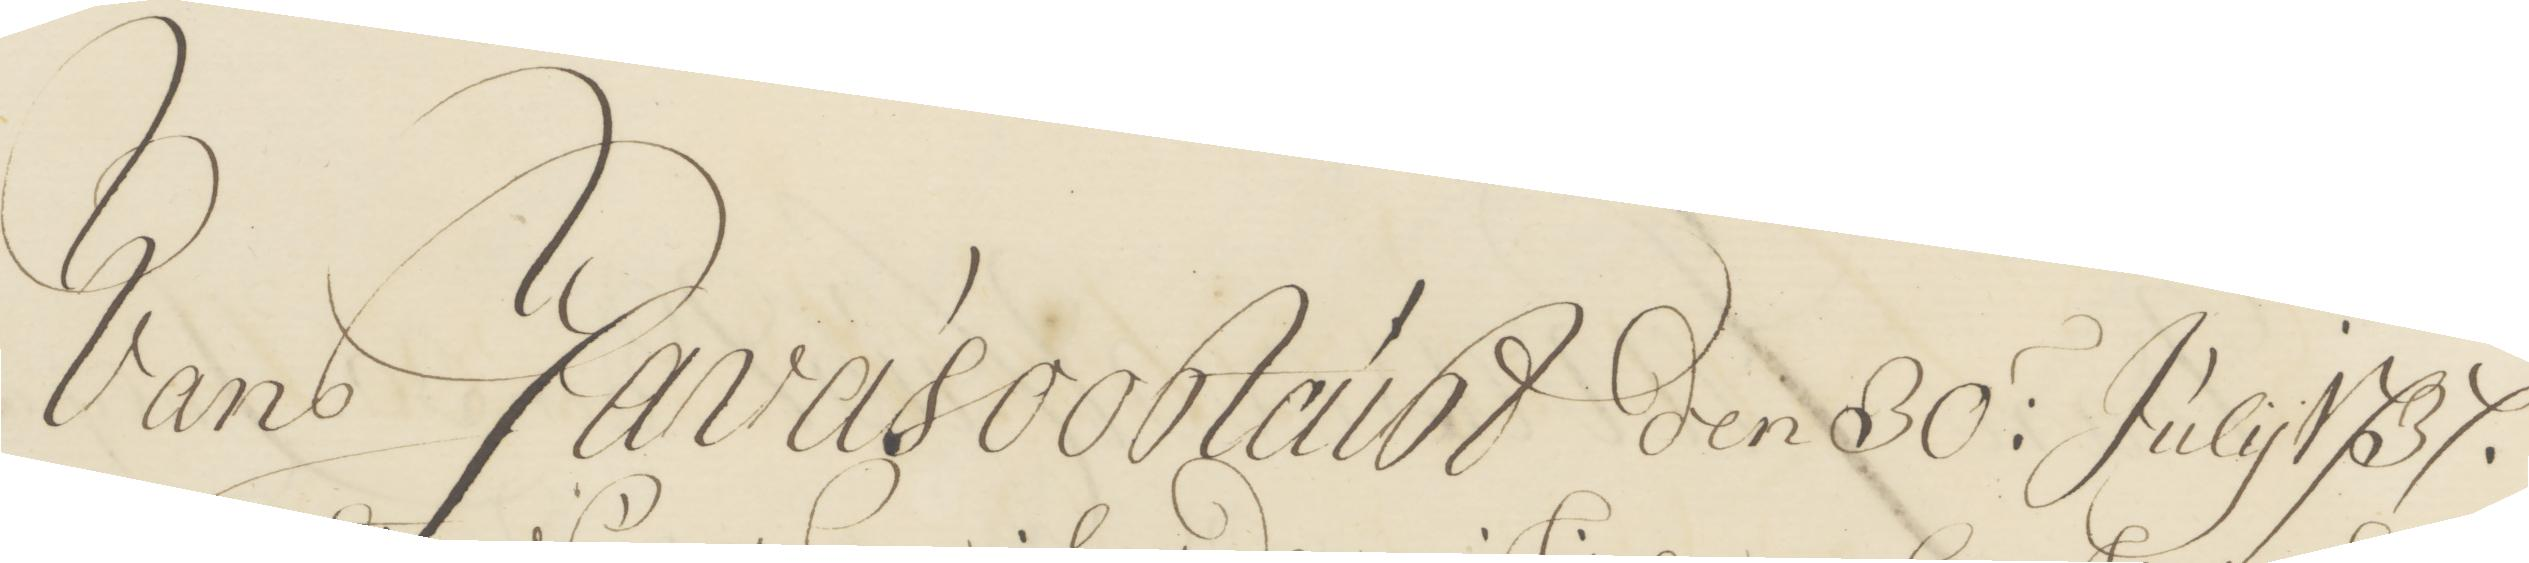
Van Java's oostcust den 30:' Julij 1737.
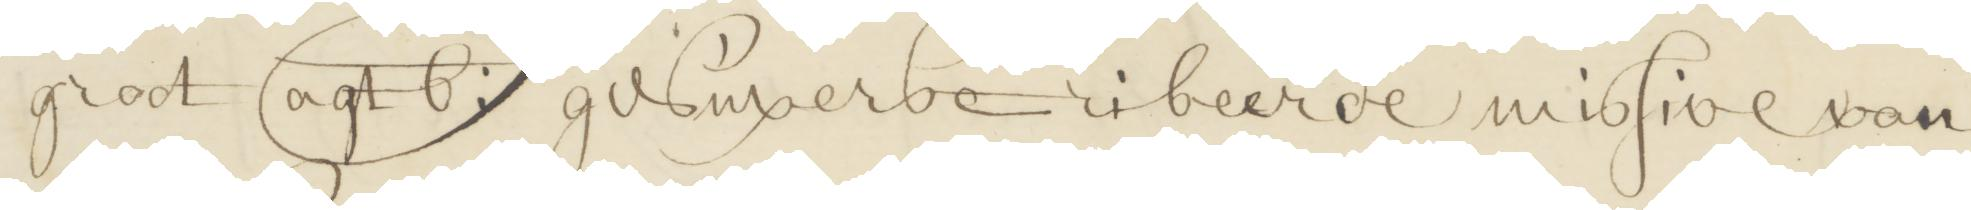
groot agtb: gesuperscribeerde missive van
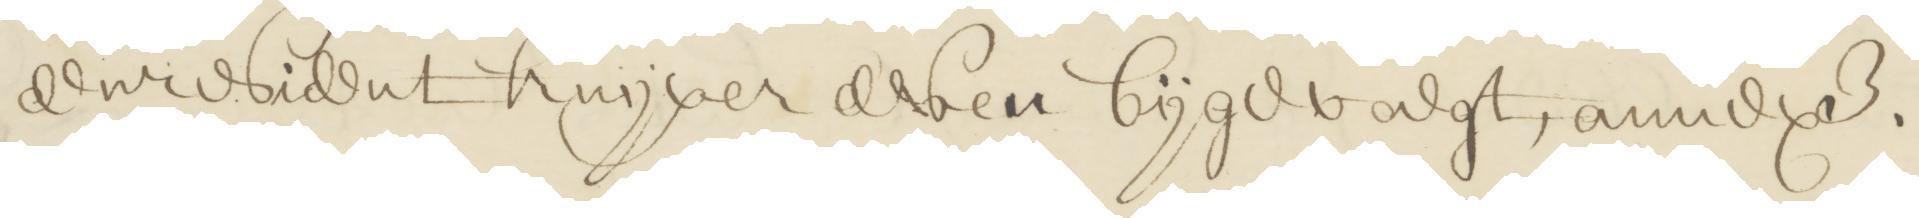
denresident kuijper desen bijgevoegt, annex 3.
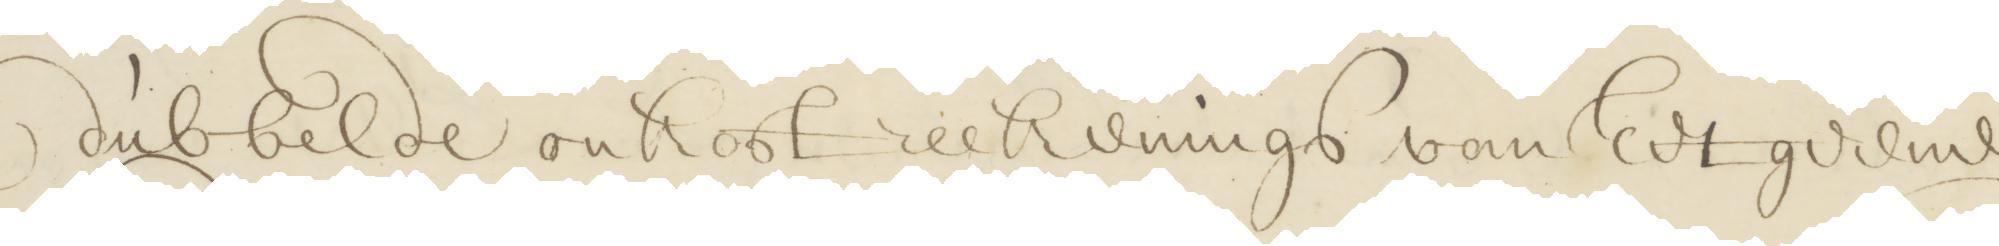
dubbelde onkost reekenings van het geene
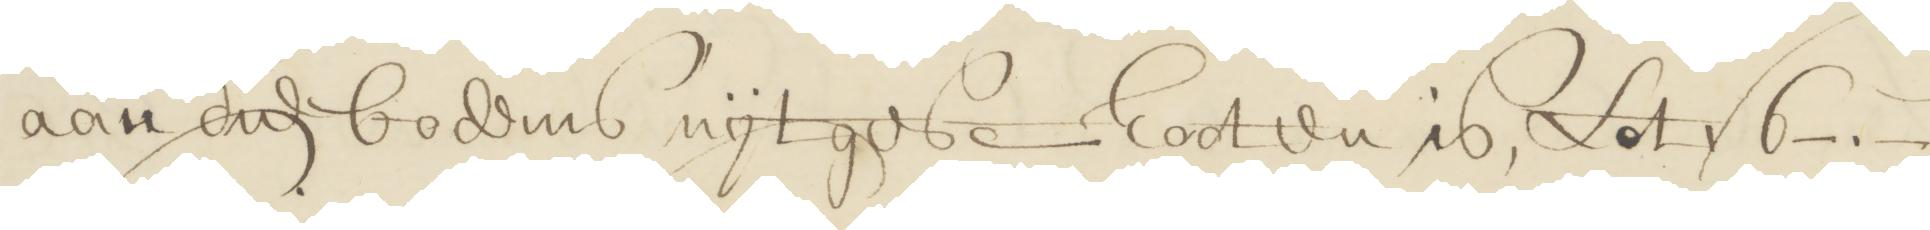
aan die bodems uijtgeschooten is, tot ƒ6—.—
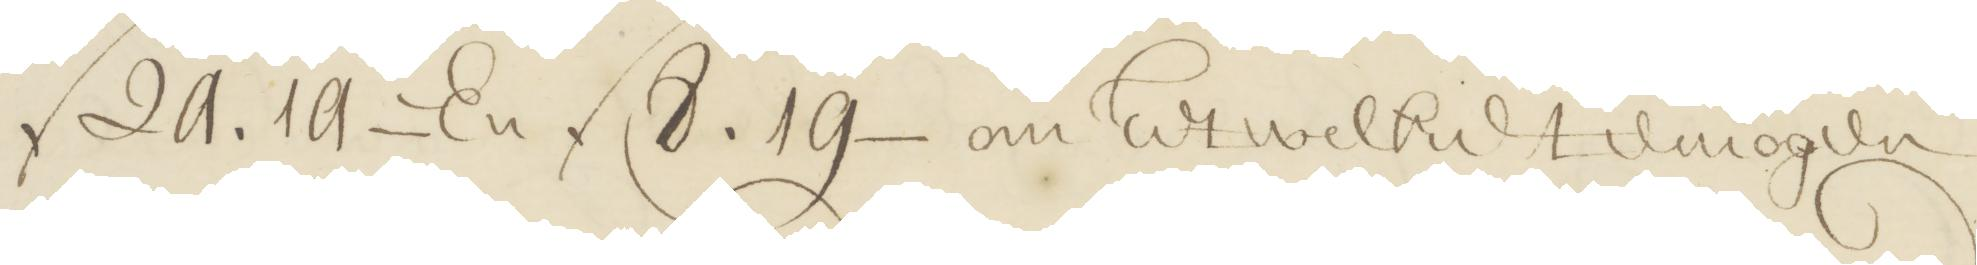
ƒ24. 14 — En ƒ8. 19— om het welke te mogen
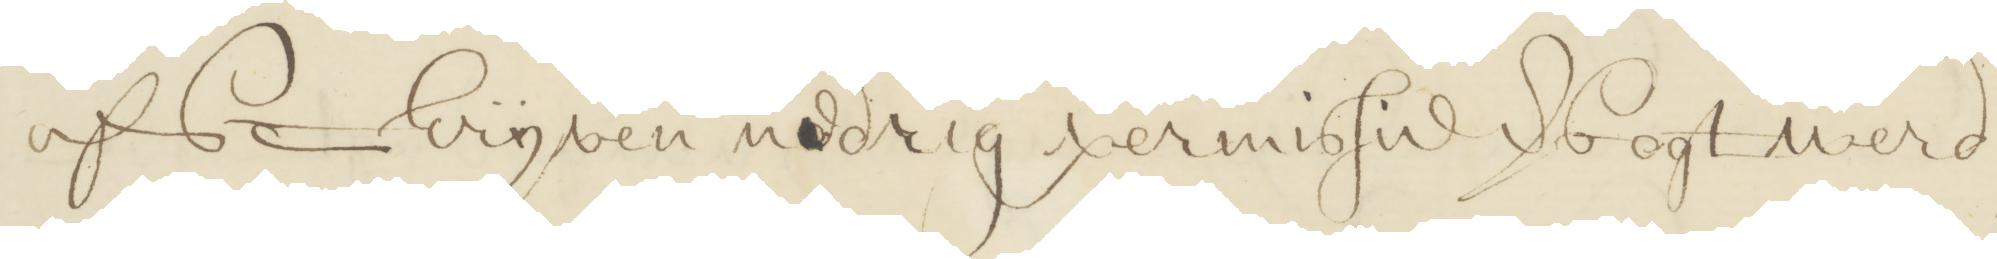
afschrijven nedrig permissie versogt werd
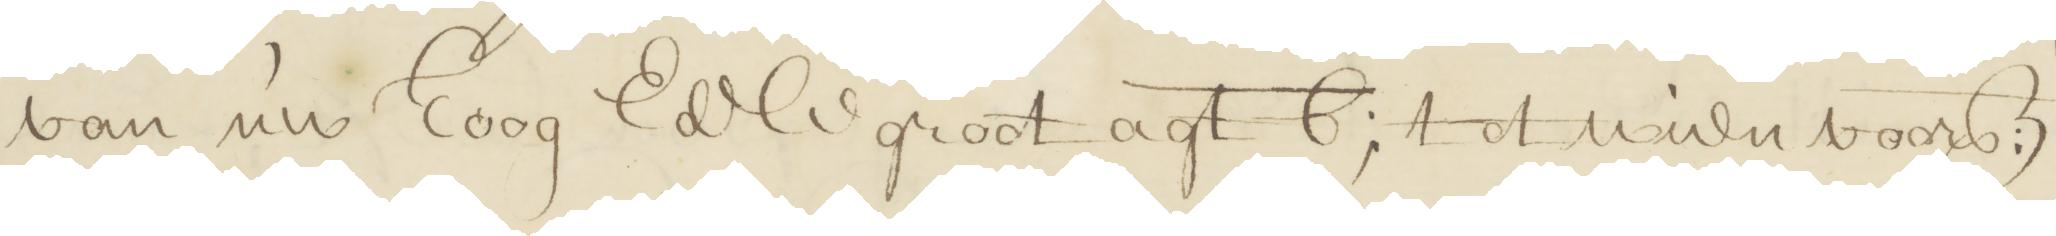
van uw hoog Edele groot agtb:, tot wien voorsz:
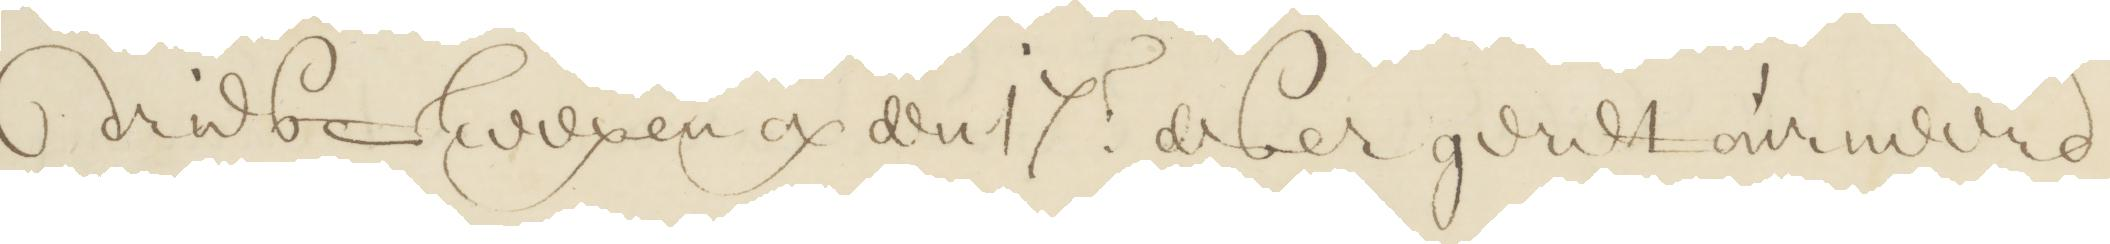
drie scheepen op den 17:' deser geretourneerd
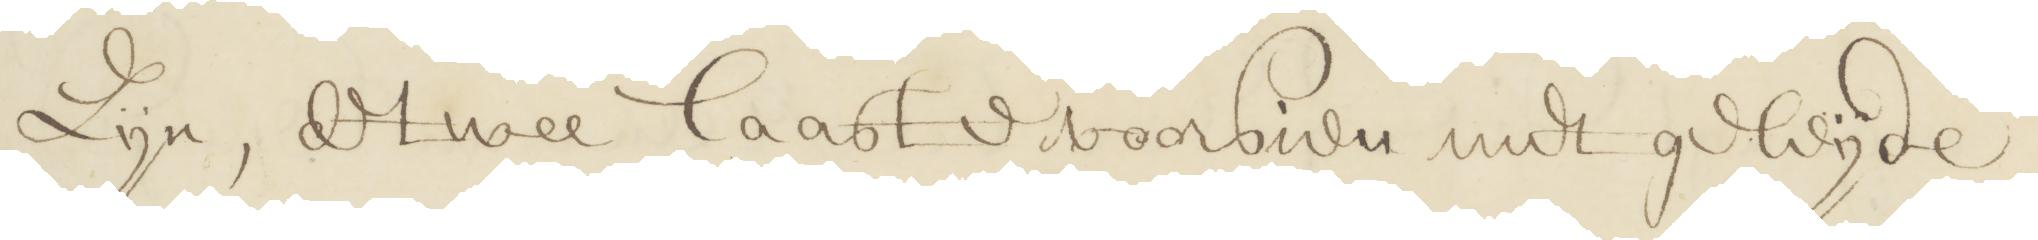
zijn, de twee laaste voorsien met geleijde
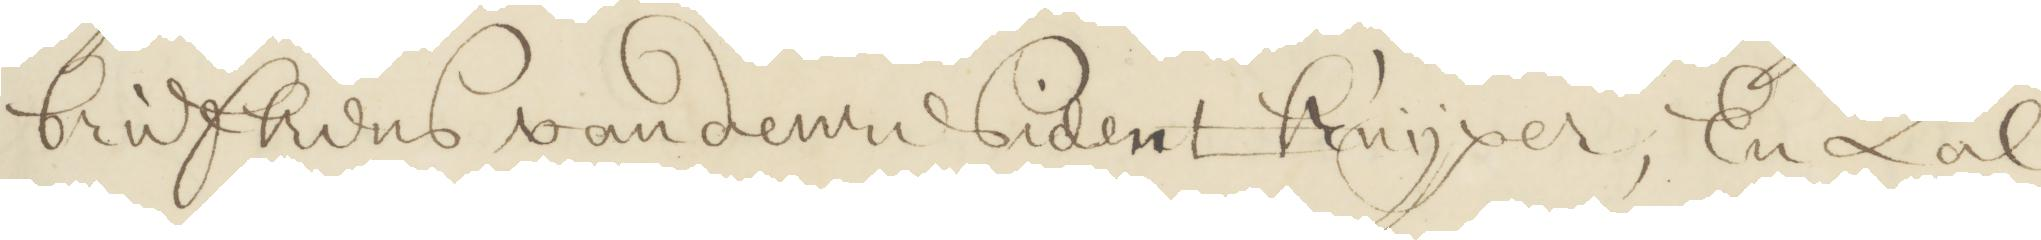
briefkens van den resident kuijper, En zal
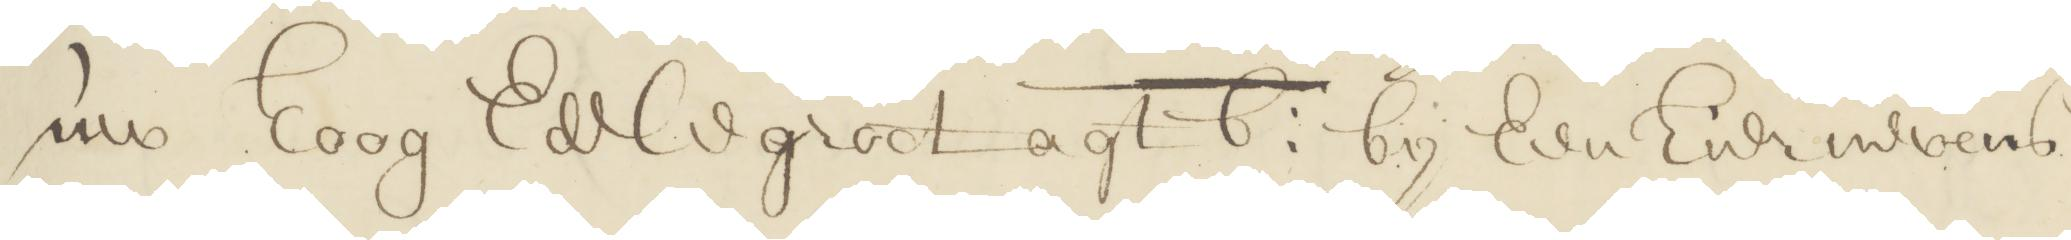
uw hoog Edele groot agtb: bij Een hier nevens
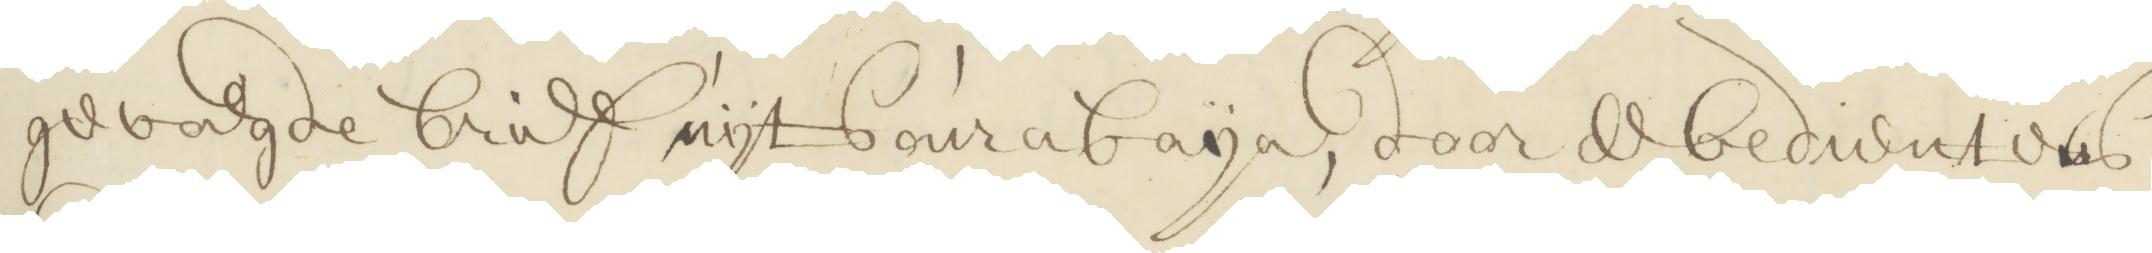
gevoegde brief uijt sourabaija, door de bedientens
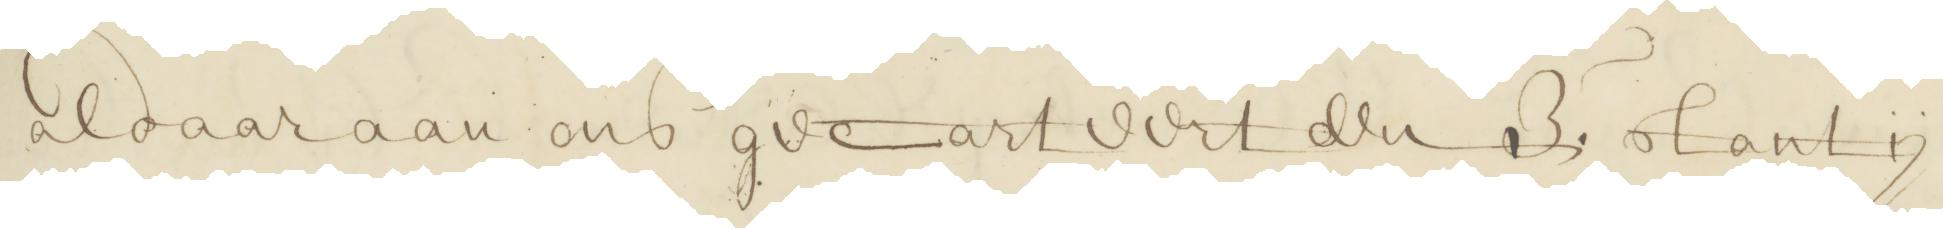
aldaar aan ons gecarteert den 3:' stantij
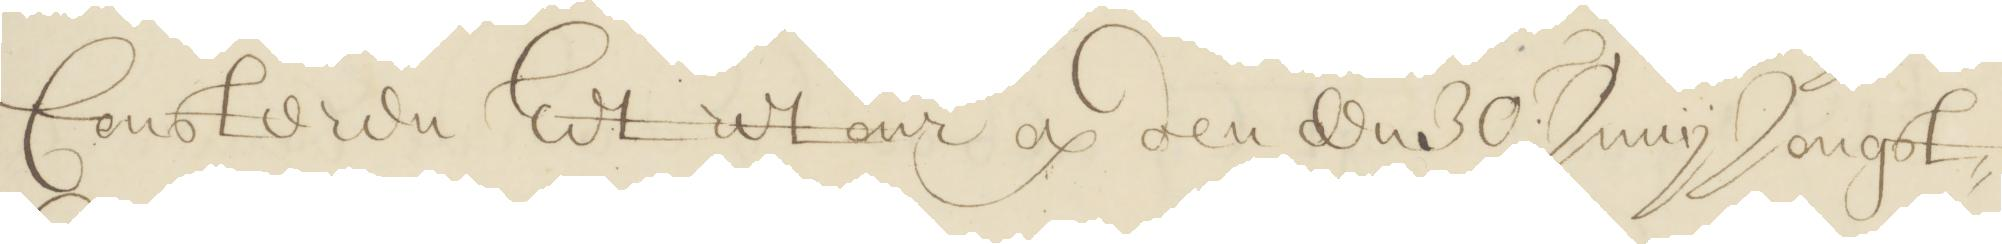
Consteren het retour op den den 30:' Junij Jongst„
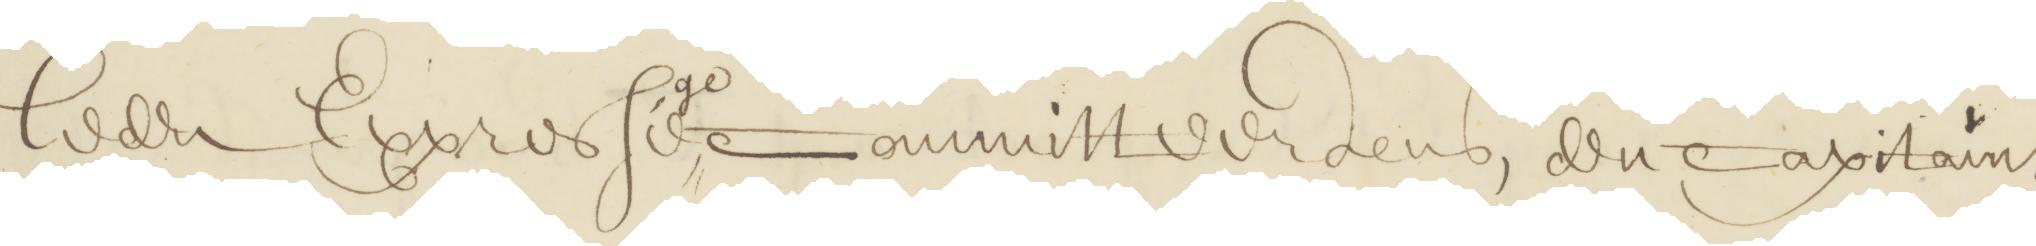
leden Expresse „ge„committeerdens, den capitain
